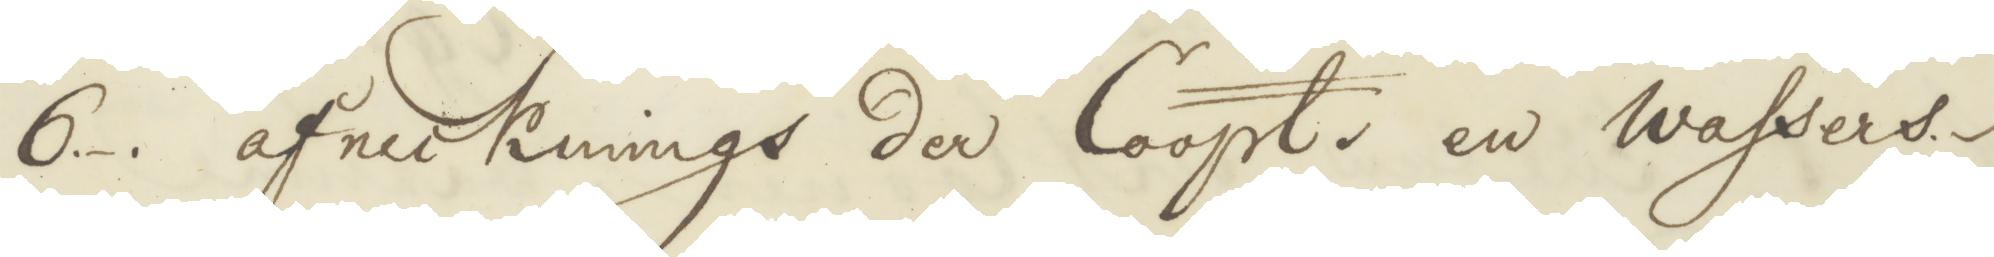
6. —. afreckenings der Coopl. en wassers. -
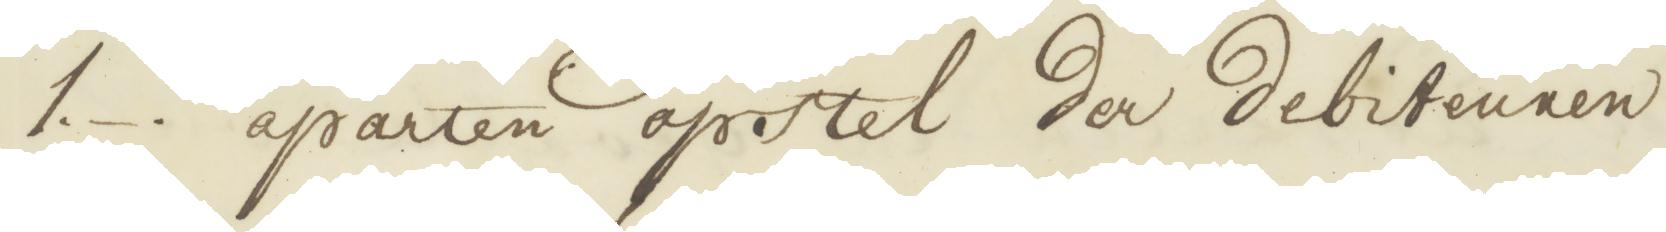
1. —. aparten opstel der debiteuren
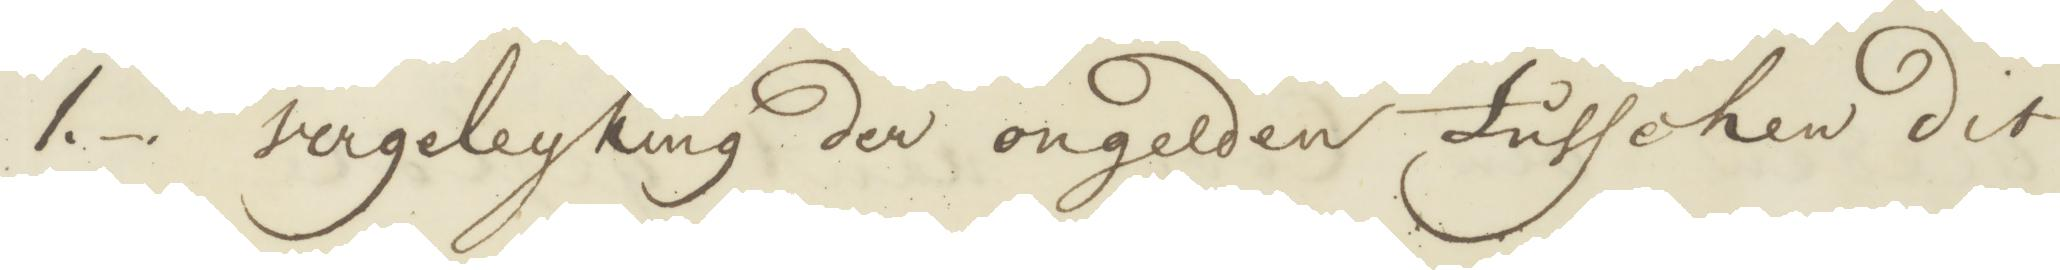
1. —. vergeleyking der ongelden tusschen dit
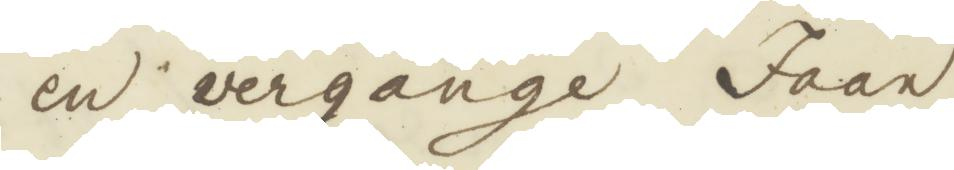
en vergange Jaar
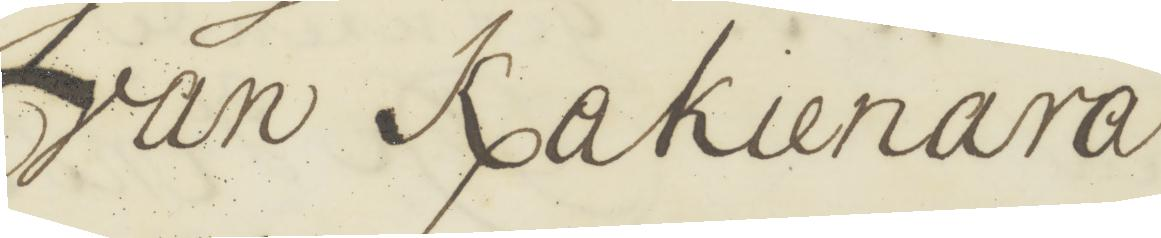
van kakienara
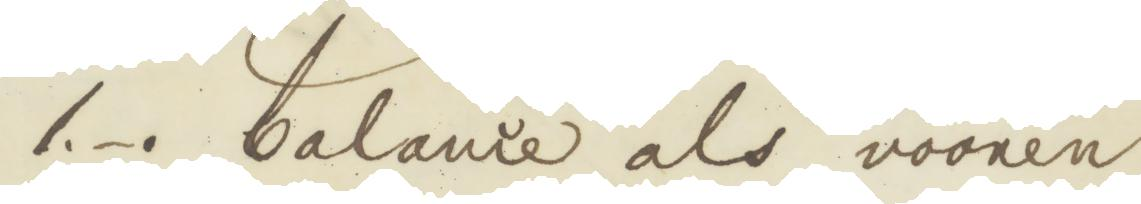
1. —. balance als vooren
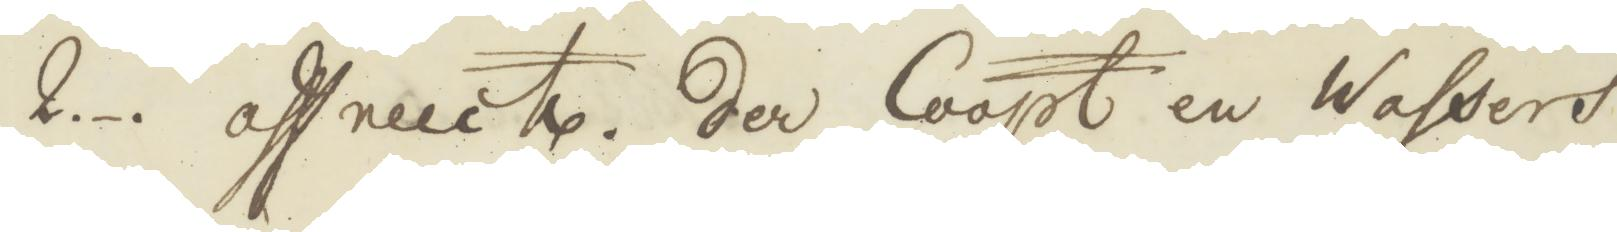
2. —. affreeck. der Coopl en Wassers
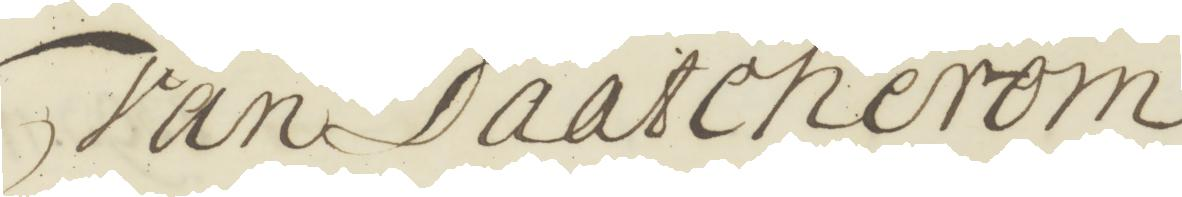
Van Daatcherom
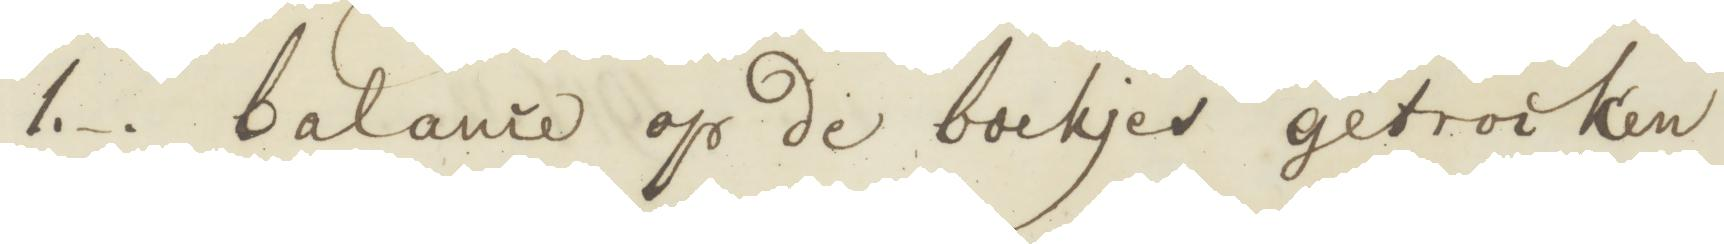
1. —. balance op de boekjes getrocken
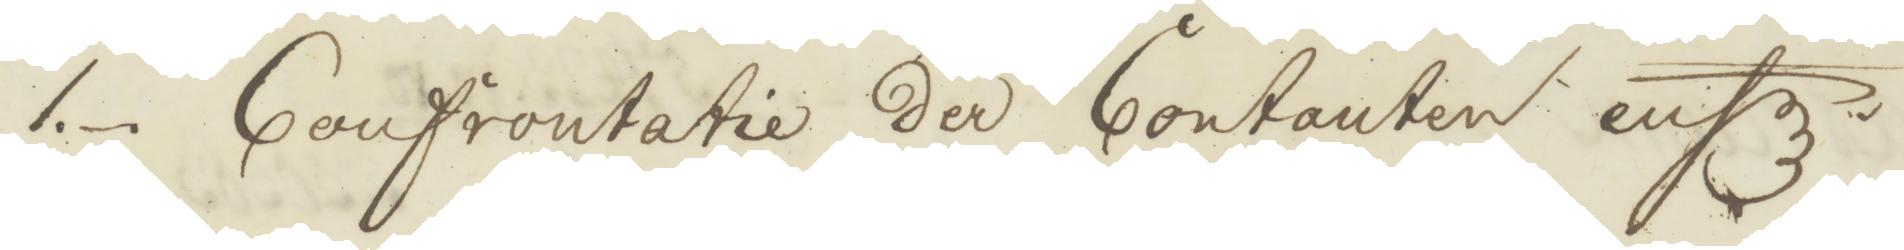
1. —. Confrontatie der Contanten ensz.-
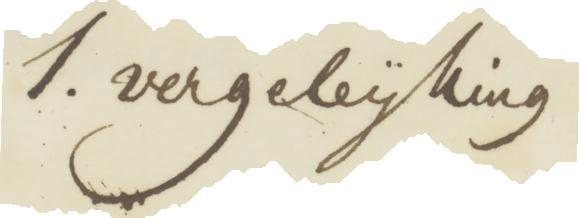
1. vergeleijking
